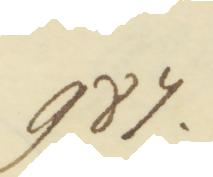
987.
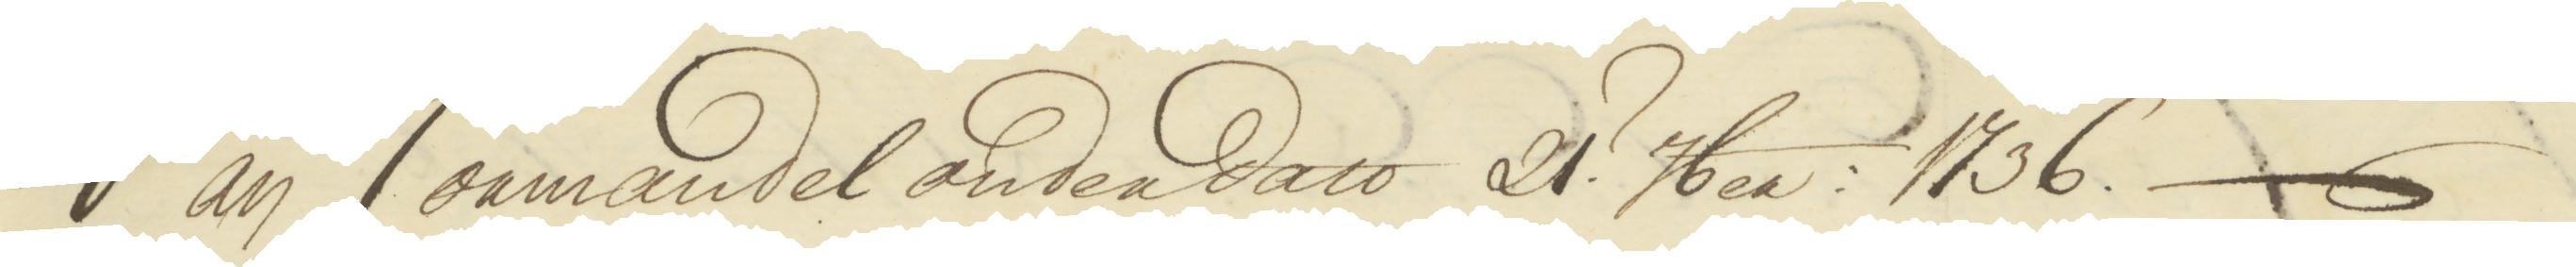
Van Cormandel onder dato 21.' 7ber: 1736. —
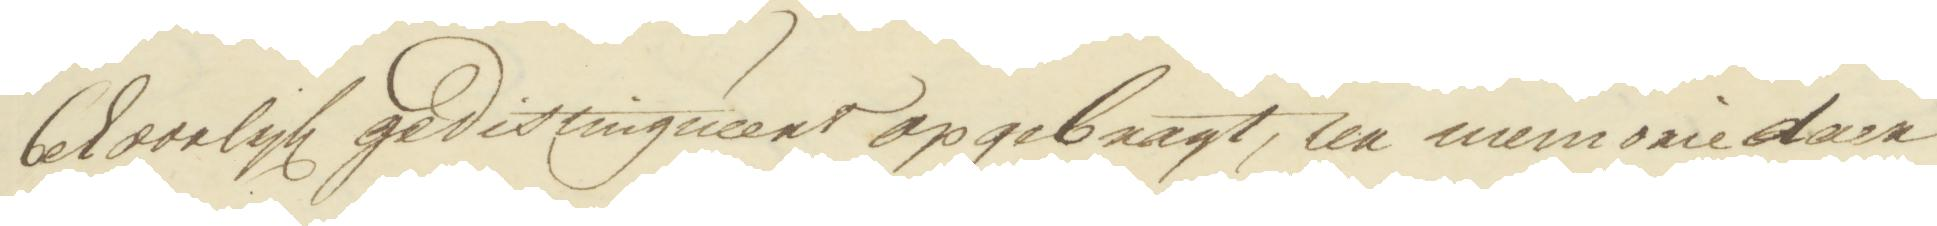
behoorlijk gedistingueert opgebragt, ter memorie daer
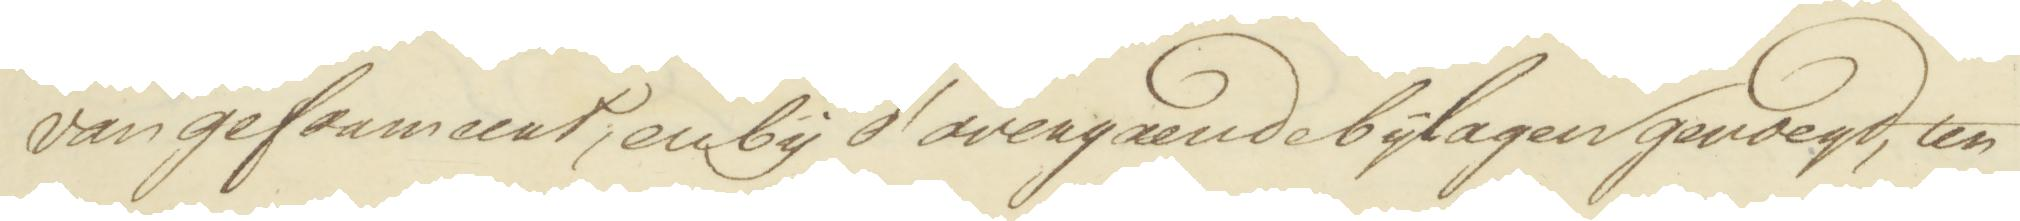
van geformeert, en bij d'overgaende bijlagen gevoegd, ten
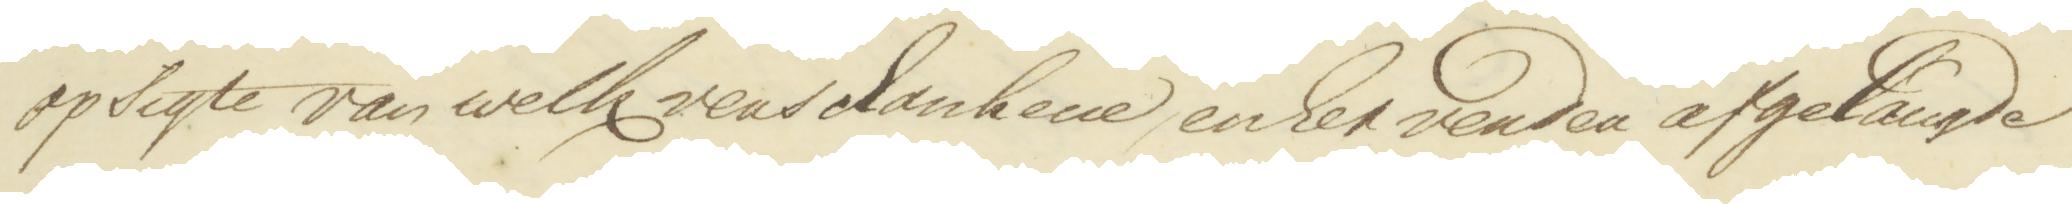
opsigte van welk verschonkene, en het verder afgelangde
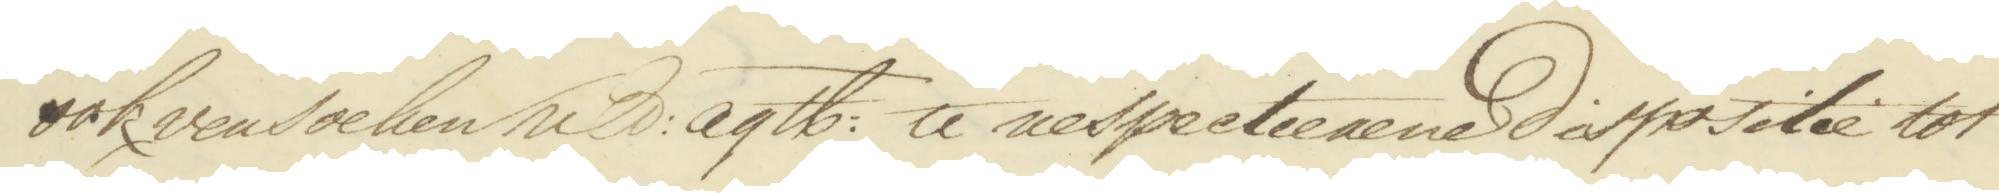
ook versoeken uEd: agtb: te respecteerene dispositie tot
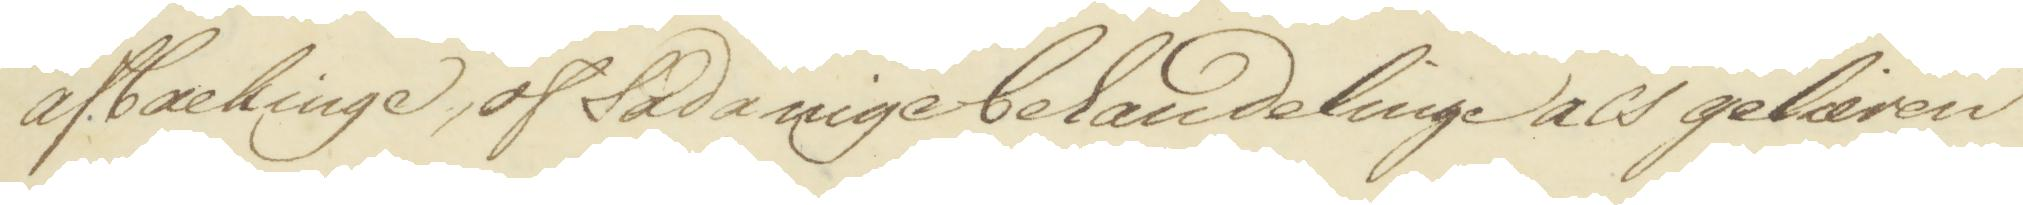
afbaekinge, of sodanige behandelinge als gelieven
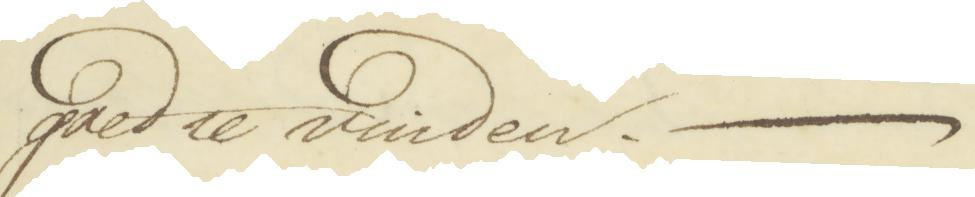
goed te vinden. —
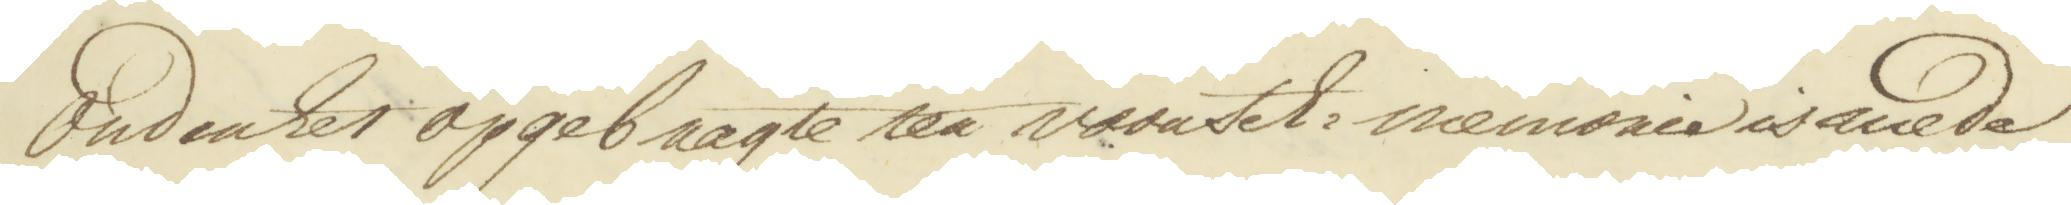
Onder het opgebragte ter voorsch: memorie is mede
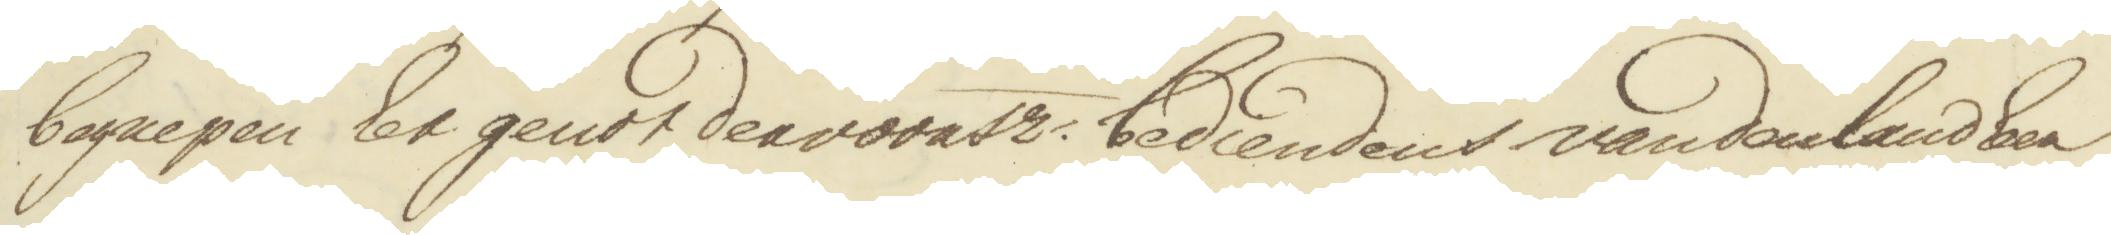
begrepen het genot der voorsz: bediendens van den landheer
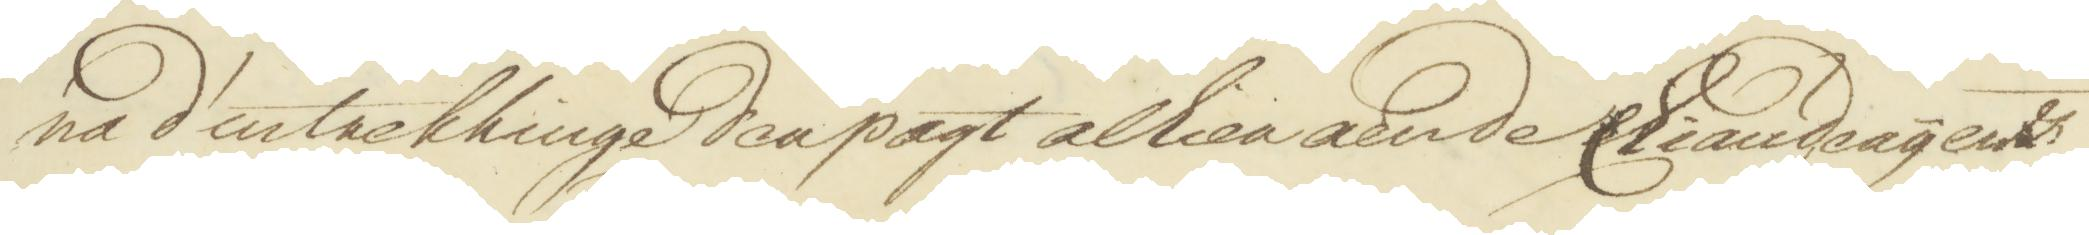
na d'intrekkinge der pagt alhier aen de Chiaudergene
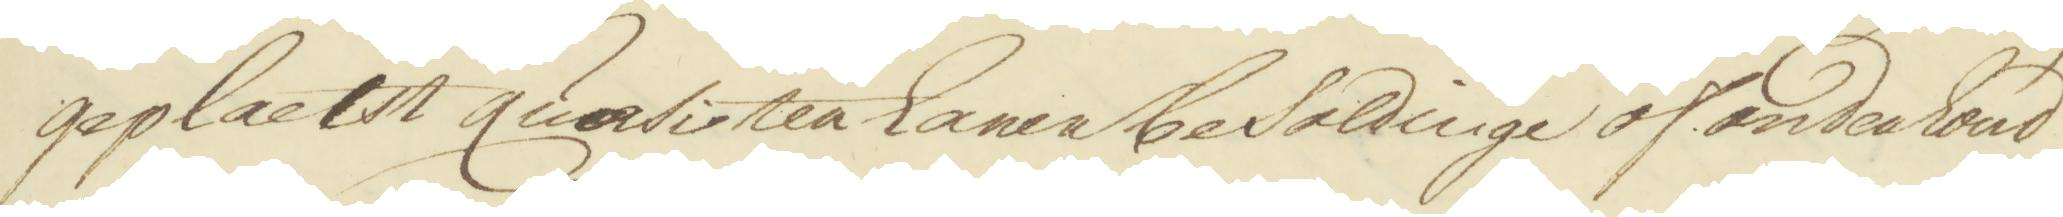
geplaetst quasi ter harer besoldinge of onderhoud
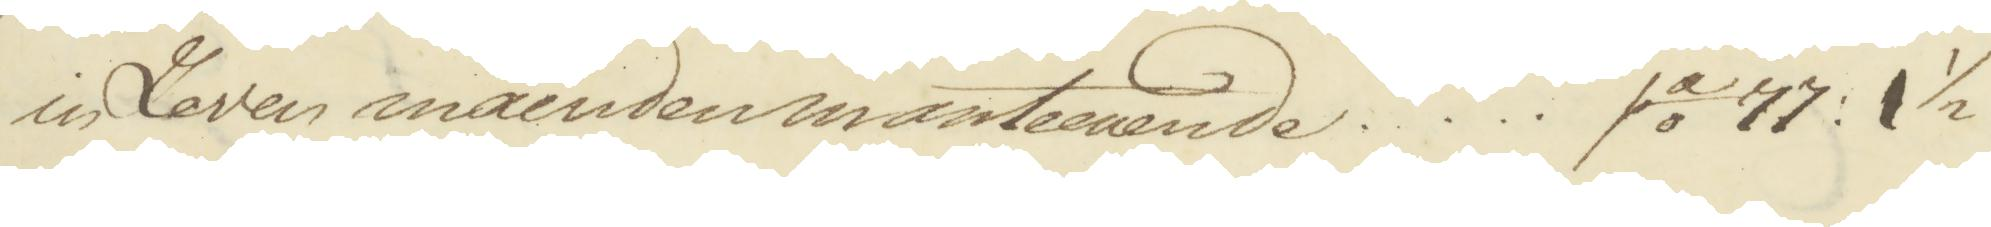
in zeven maenden monteerende . . . . . pa/o 77: 1½
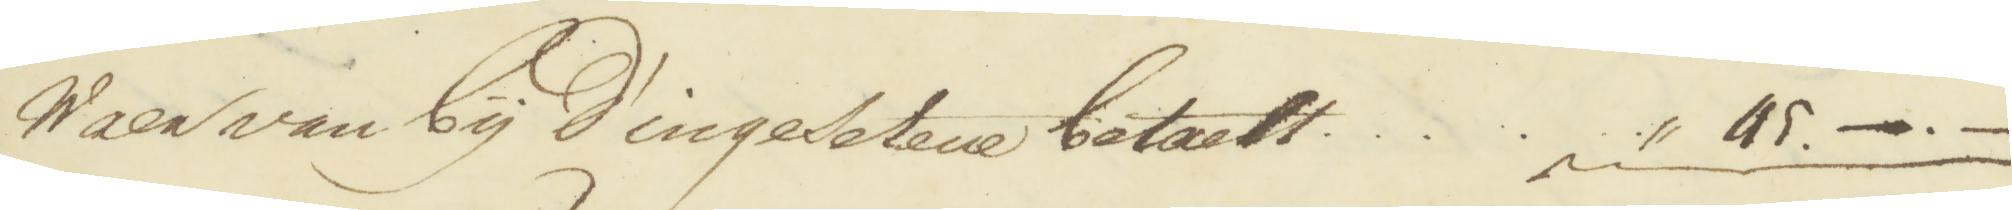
Waer van bij d'ingesetene betaelt . . . . . . . „ 45. —. —
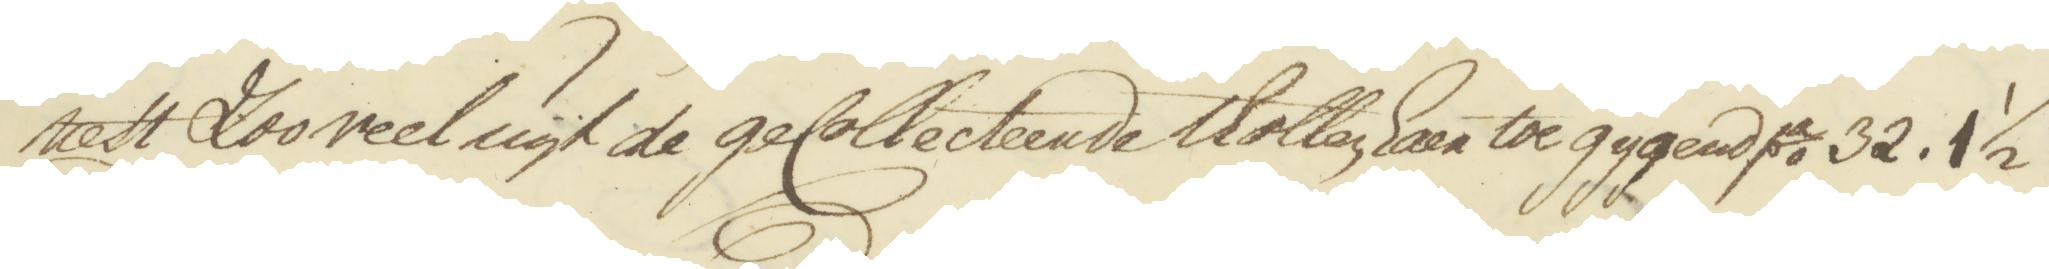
rest zoo veel uijt de gecollecteerde thollen haer toe g'ygend pa/o 32. 1½
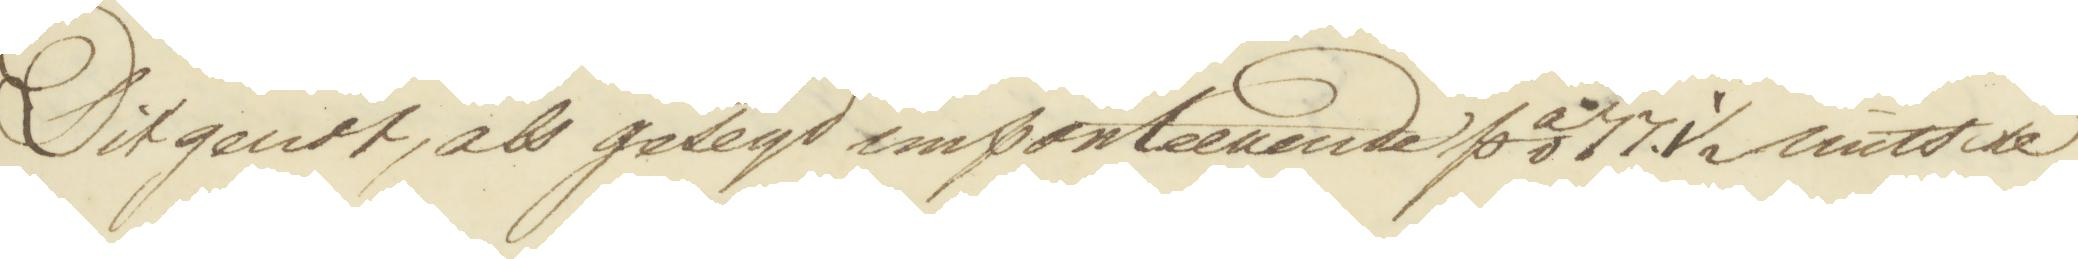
Dit genst, als geseyd importeerende pa/o 77.1½ mits te
